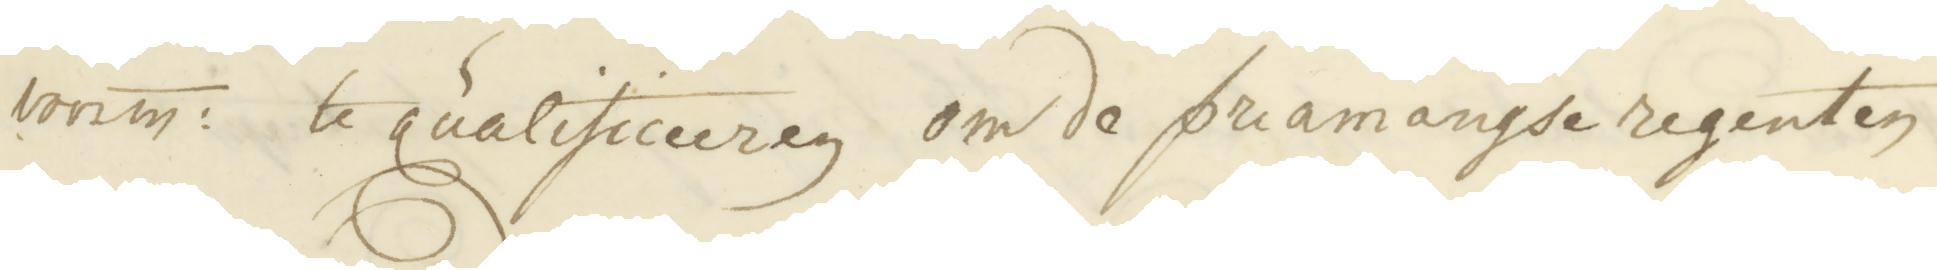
voorm: te qualificeeren om de priamangse regenten
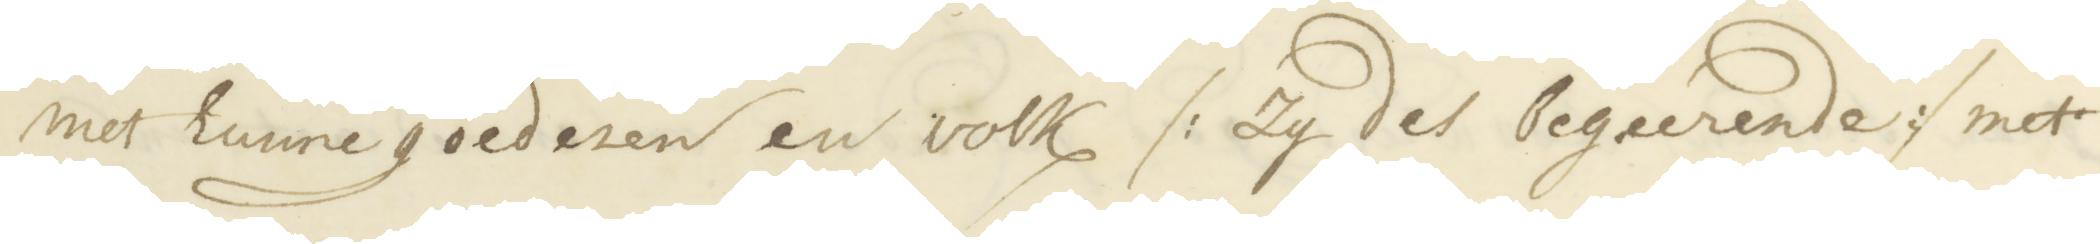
met hunne goederen en volk /: zy des begeerende :/ met
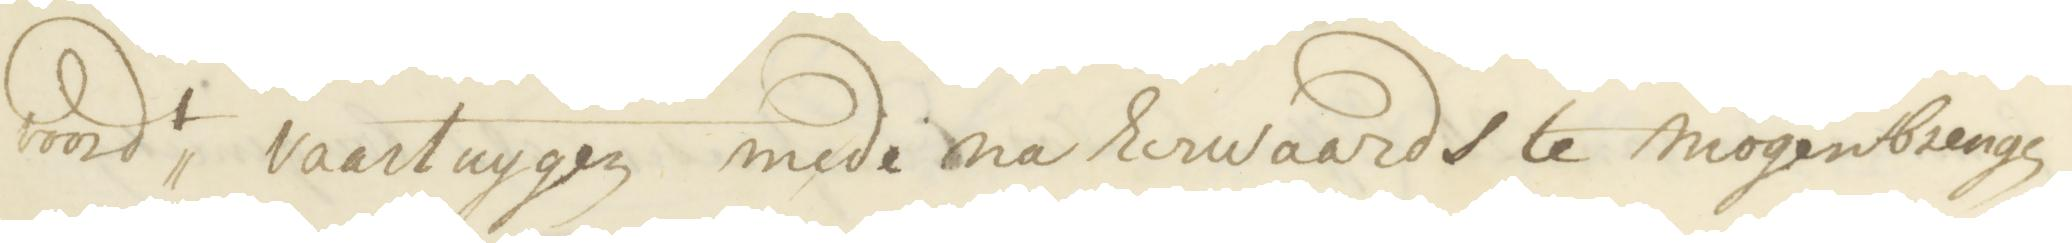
voord„t vaartuygen mede na herwaards te mogen brengen
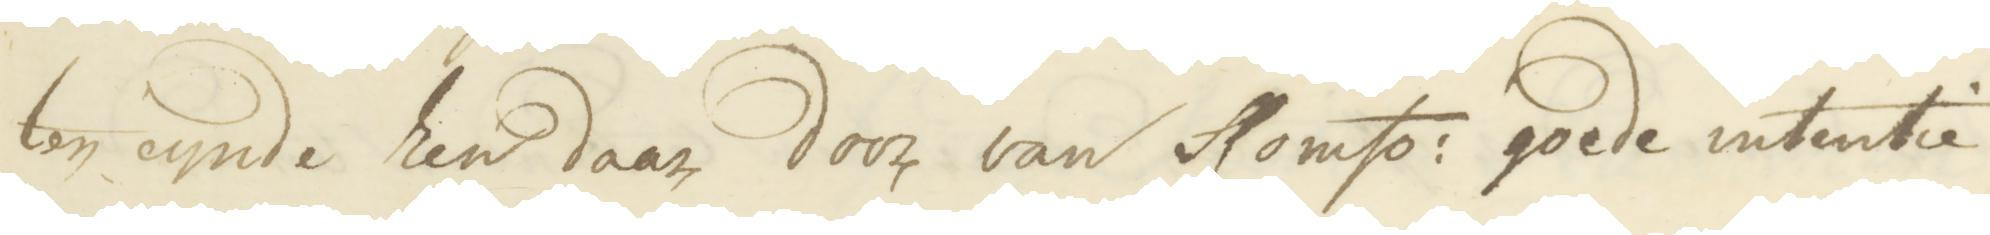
ten eynde hen daar door van sComp: goede intentie
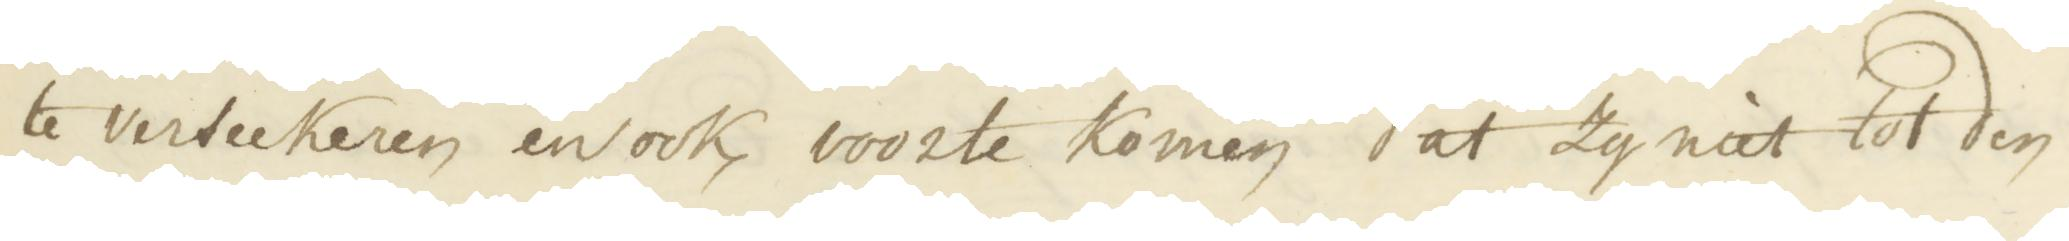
te verseekeren en ook voorte komen dat zy niet tot den
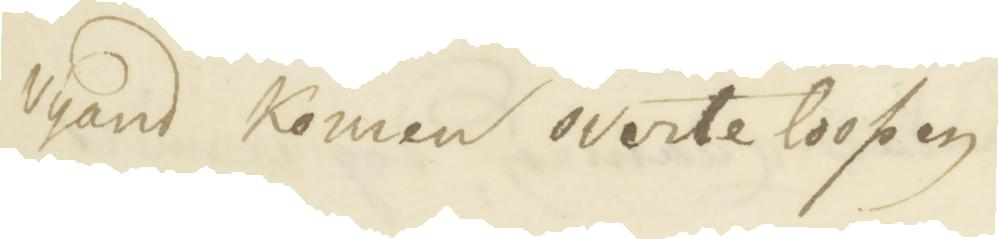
vyand komen overte loopen
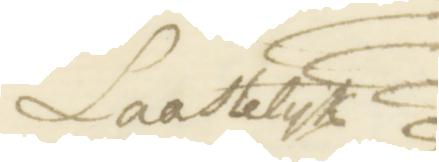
Laastelyk
